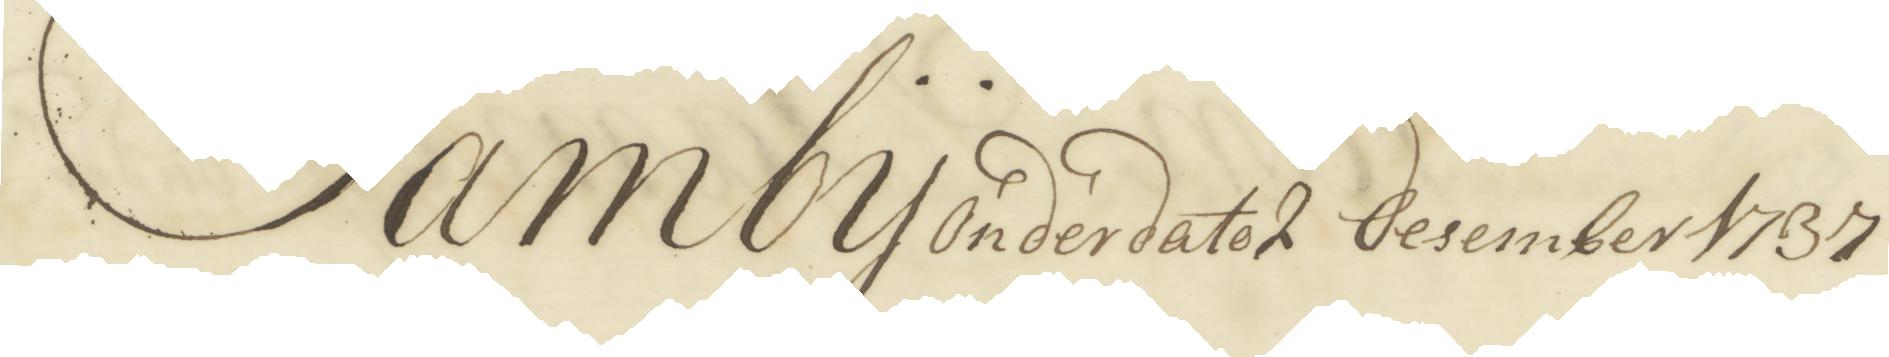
Van Jambij onder dato 2 desember 1737
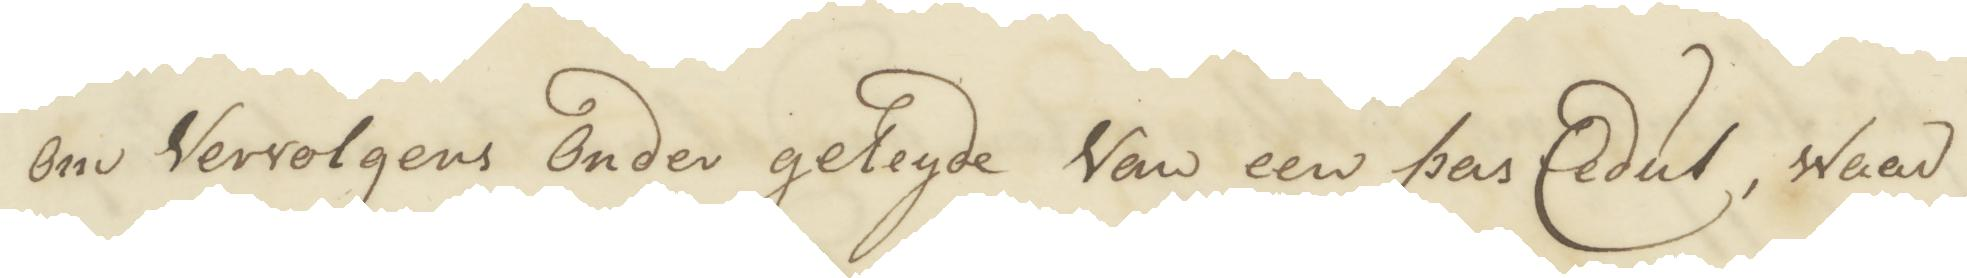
om vervolgens onder geheyde van een pascedus, waar
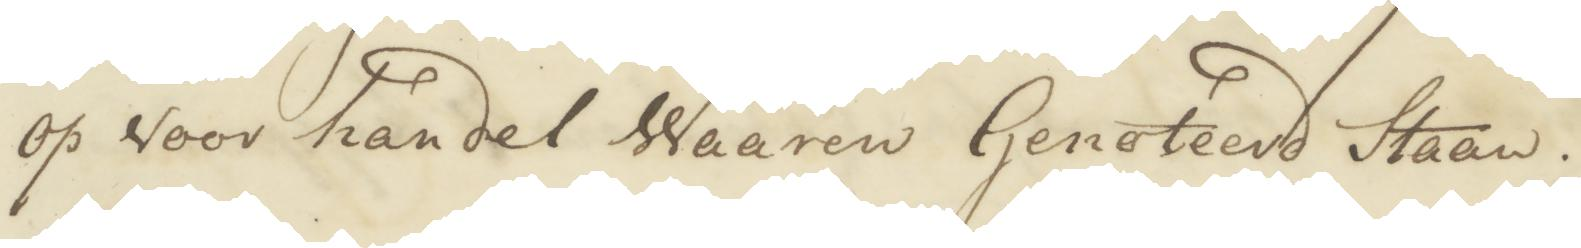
op voor handel waaren Genoteerd staan.
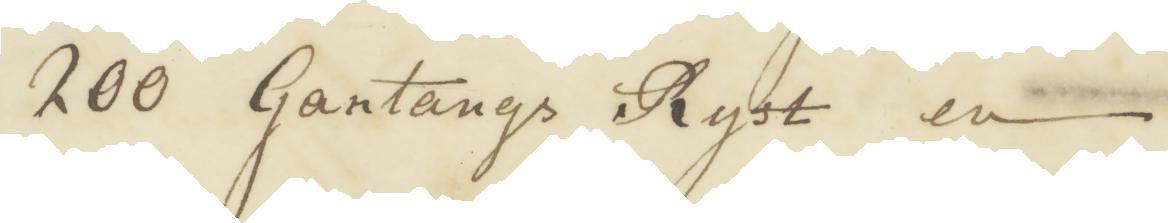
200 Gantangs Rijst en
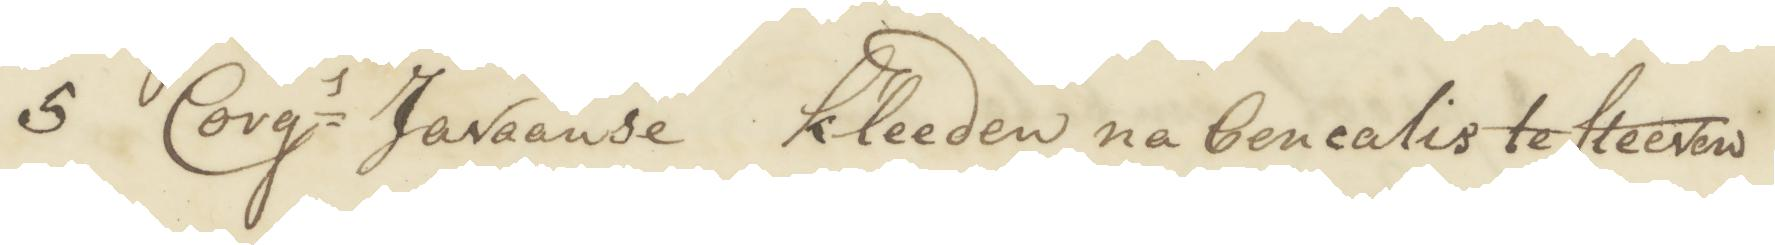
S Corg=s Javaanse kleeden na bencalis te steeven
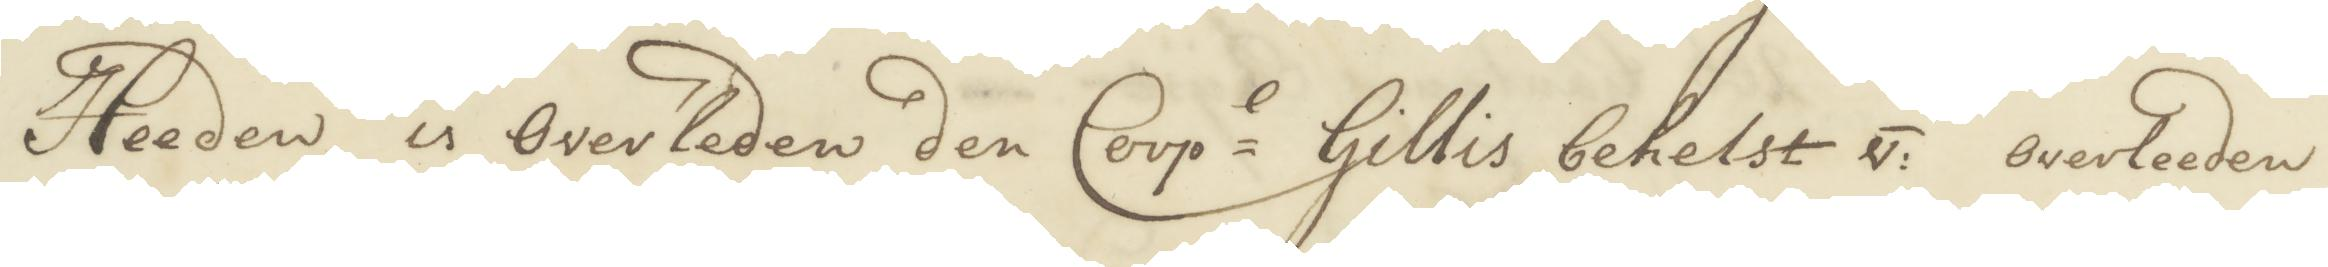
Heeden in overleden den Corp=l Gillis behelst v: overleeden
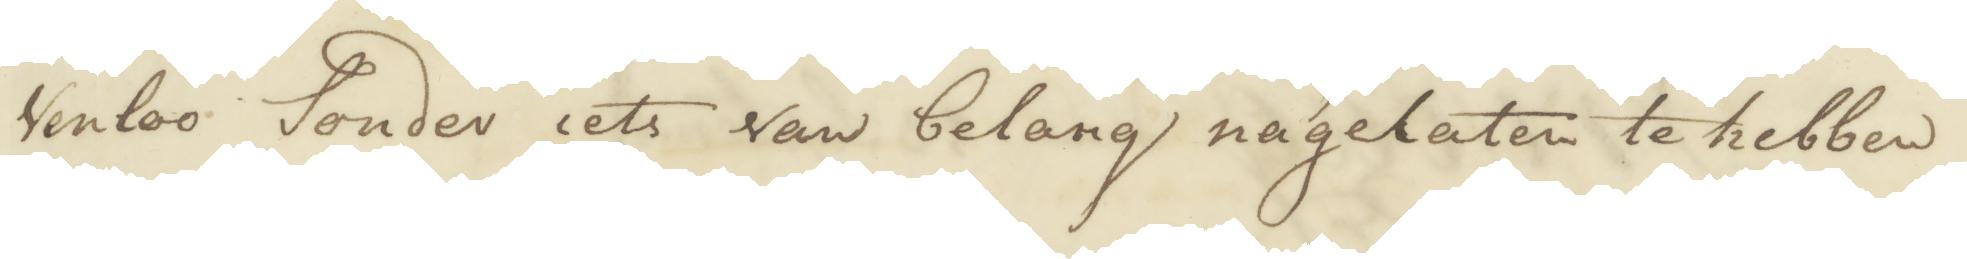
Venloo sonder iets van belang nagelaten te hebben
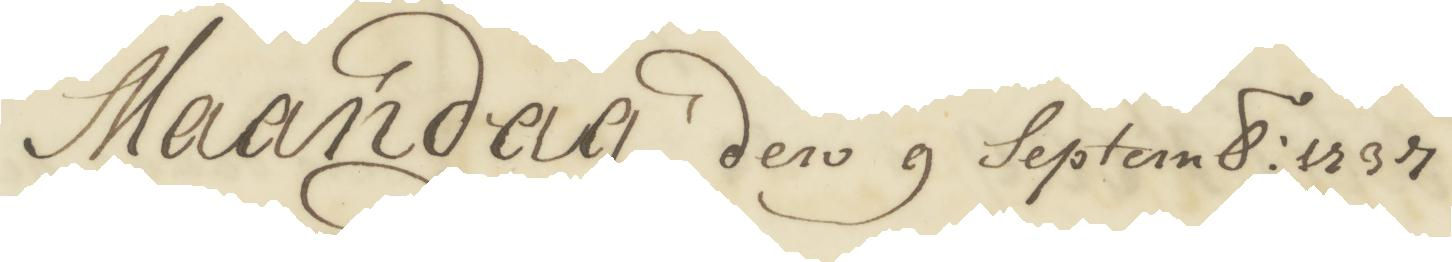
Maandag den 9 Septemb: 1737
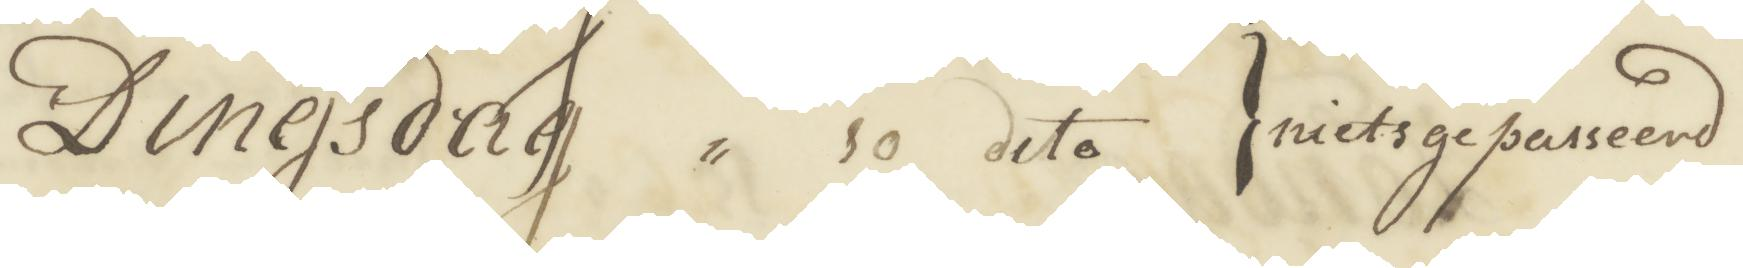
Dingsdag „ 10 dito } niets gepasseerd
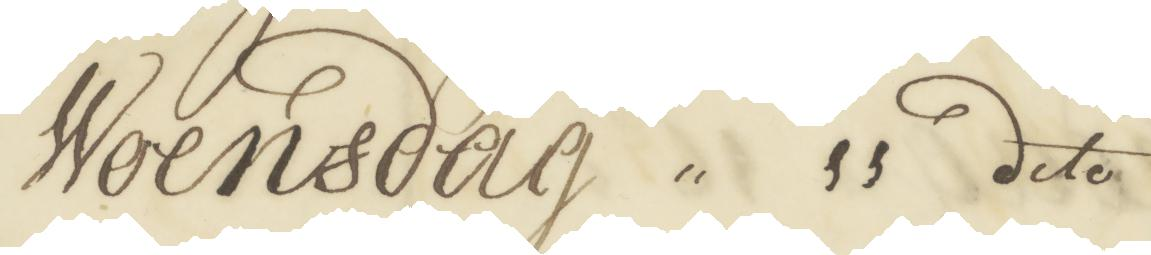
Woensdag „ 15 dito
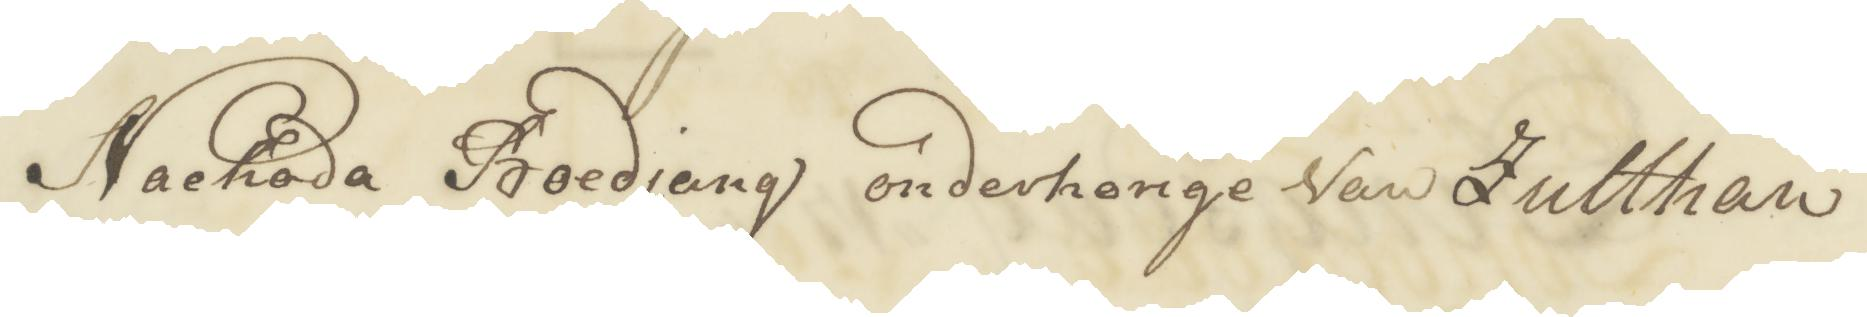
Nachoda boedjang onderhorige van Zulthan
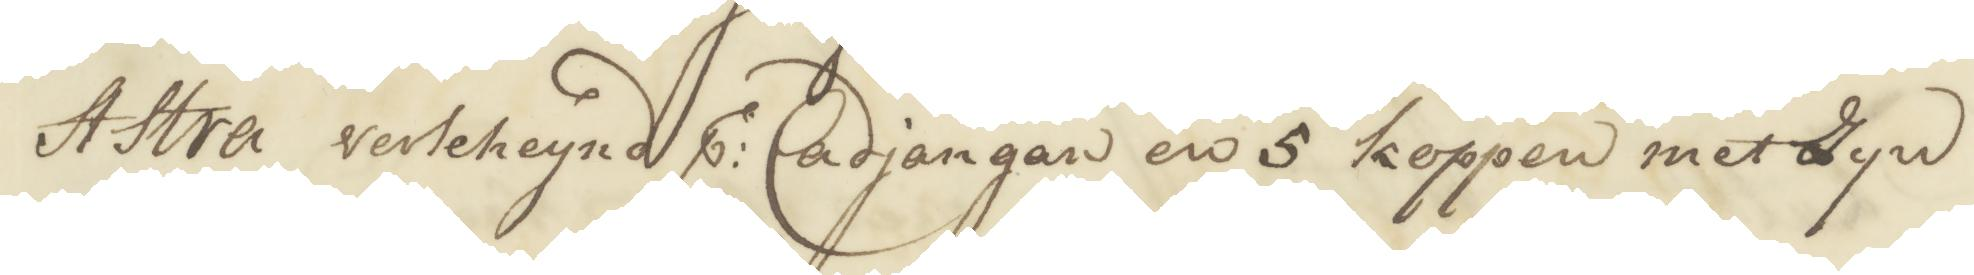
Astra verscheijnd 6: Cadjangan en 5 koppen met zyn
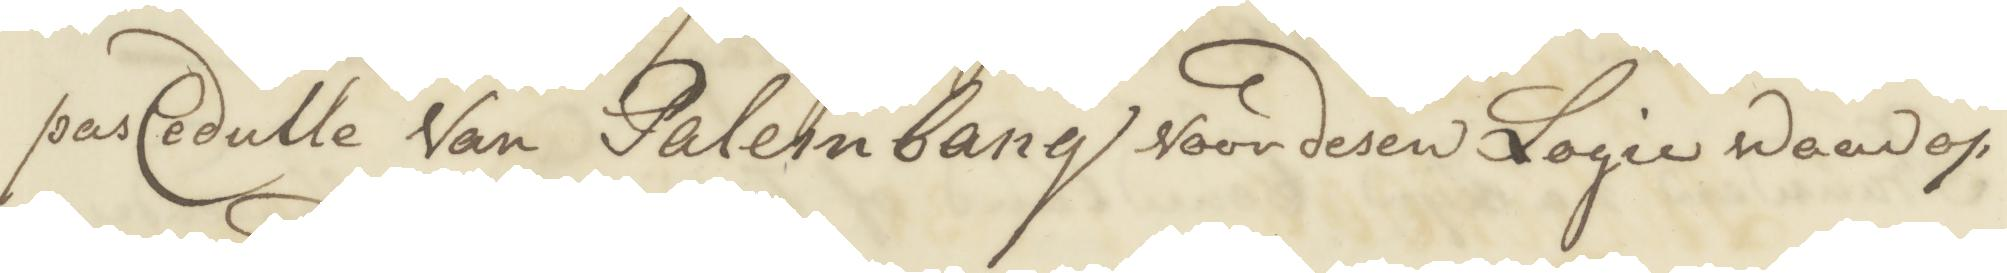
pascedulle van Palembang voor desen Logie waar op
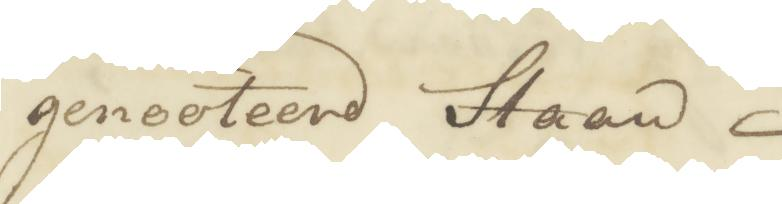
genooteerd staan
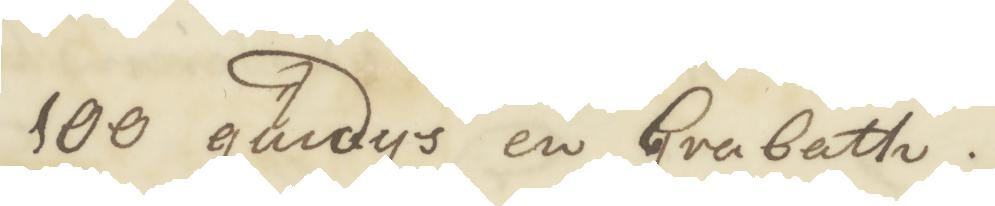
100 guidys en Grabatti.
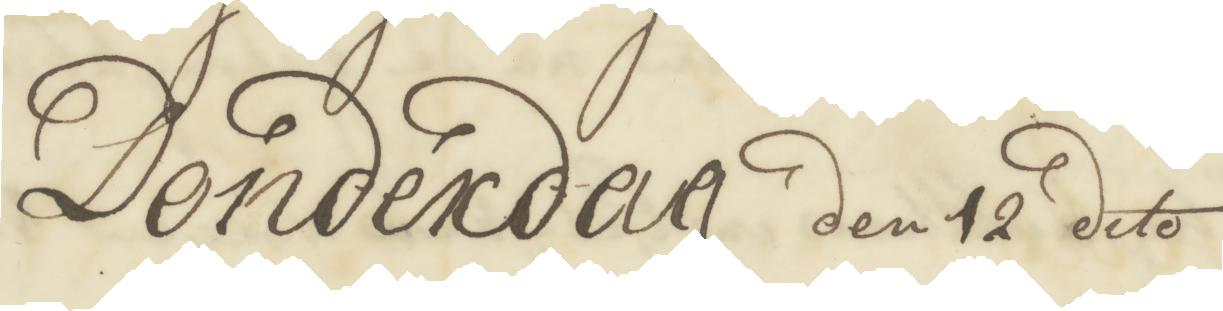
Donderdag den 12 dito
